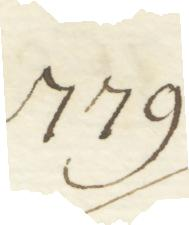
779
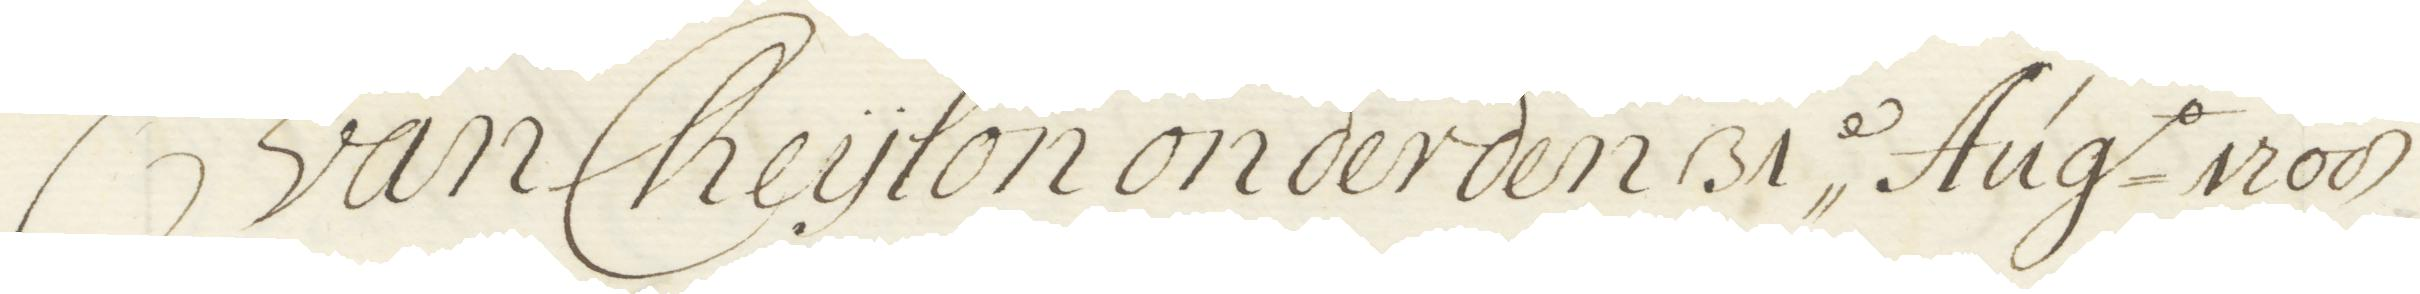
van Cheijlon onder den 31„e Aug=o 1708
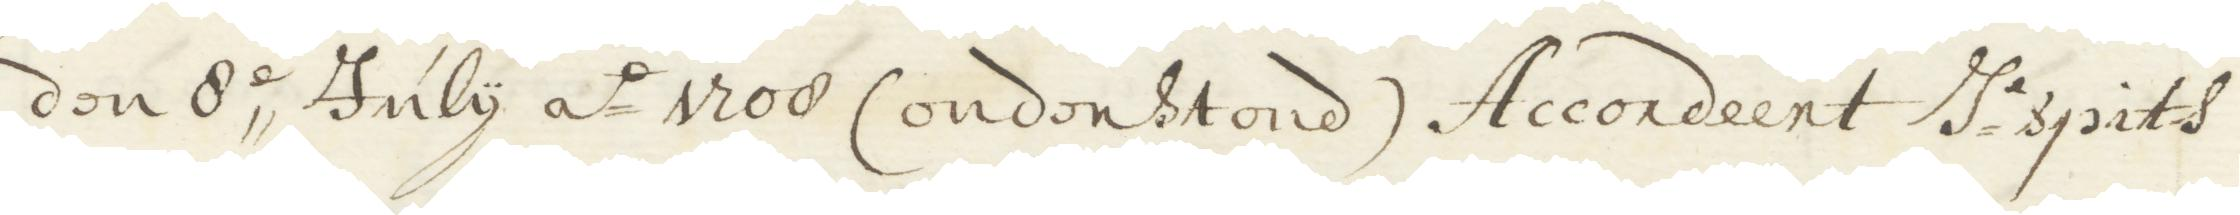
den 8„e Iulij a=o 1708 (onderstond) Accordeert I:e spits
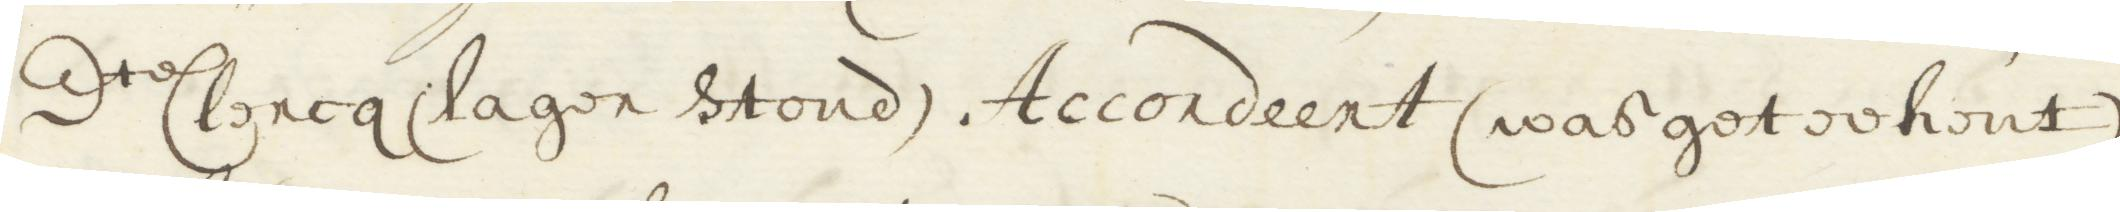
Ete Clercq (lager stond) Accordeert (was geteekent)
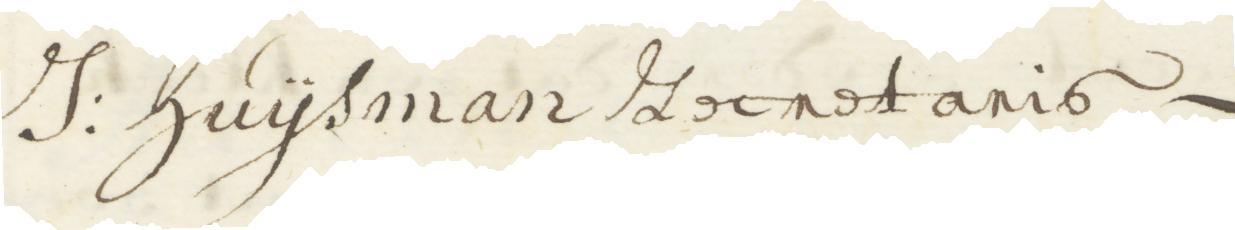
J: huijsman Zecretaris —
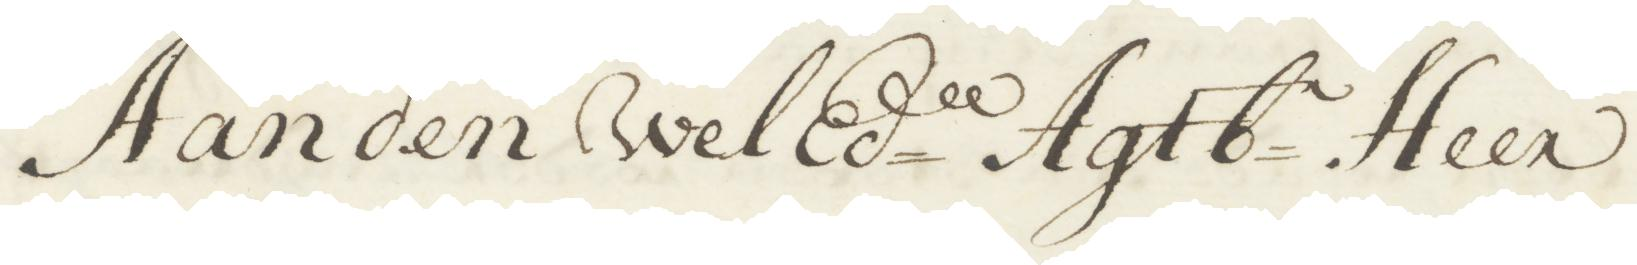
Aan den wel Ed=le Agtb=r Heer
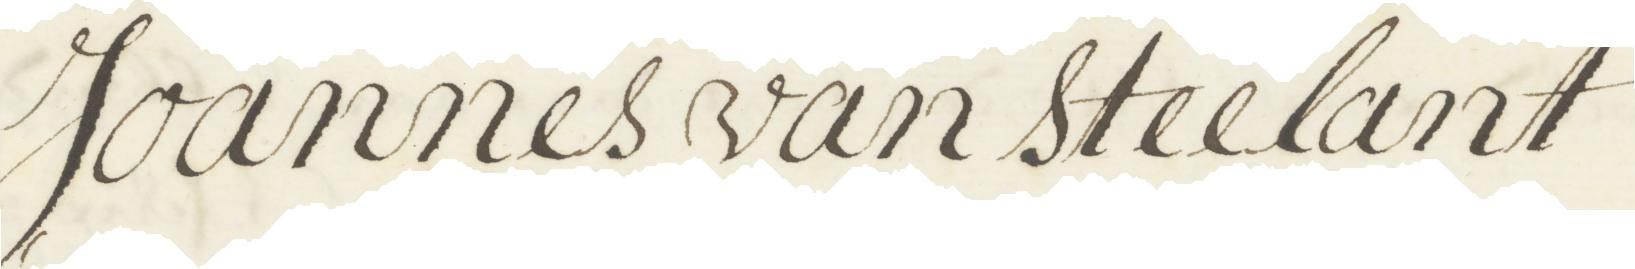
Joannes van steelant
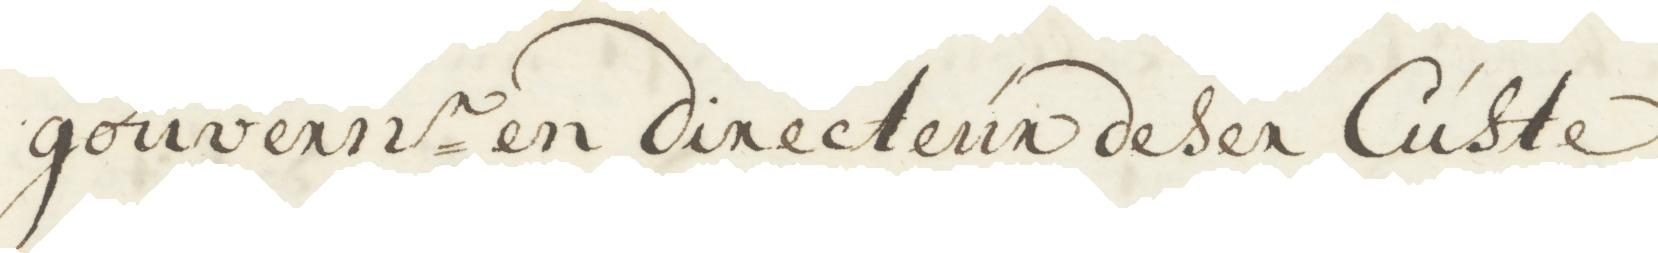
gouvern=r en directeur deser Custe
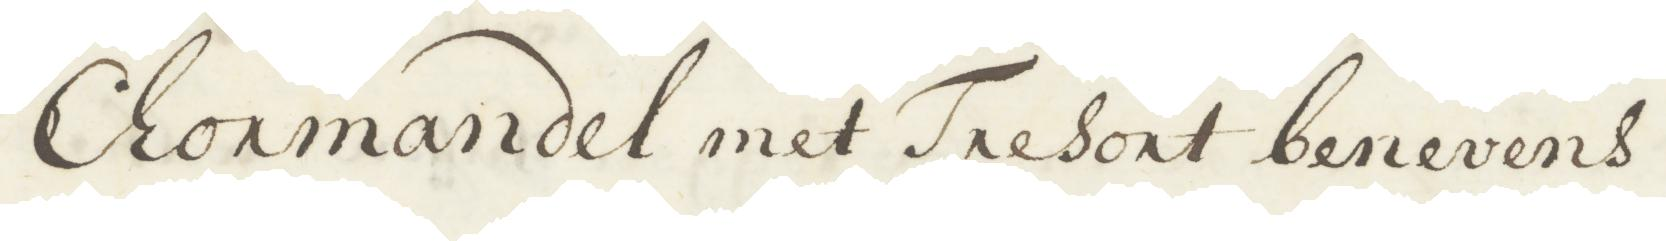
Chormandel met Tresort benevens
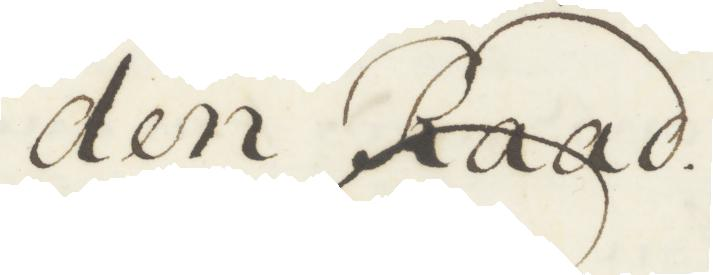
den Raad.
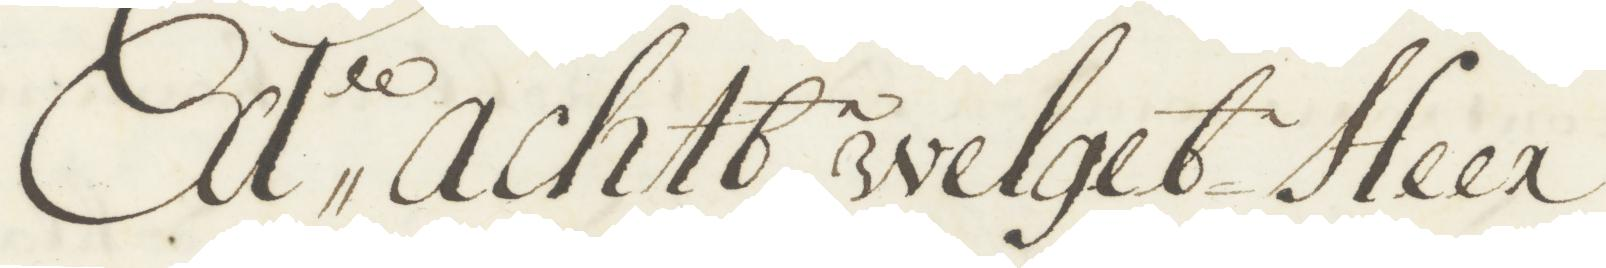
Ed„le achtb:r wel geb=r Heer
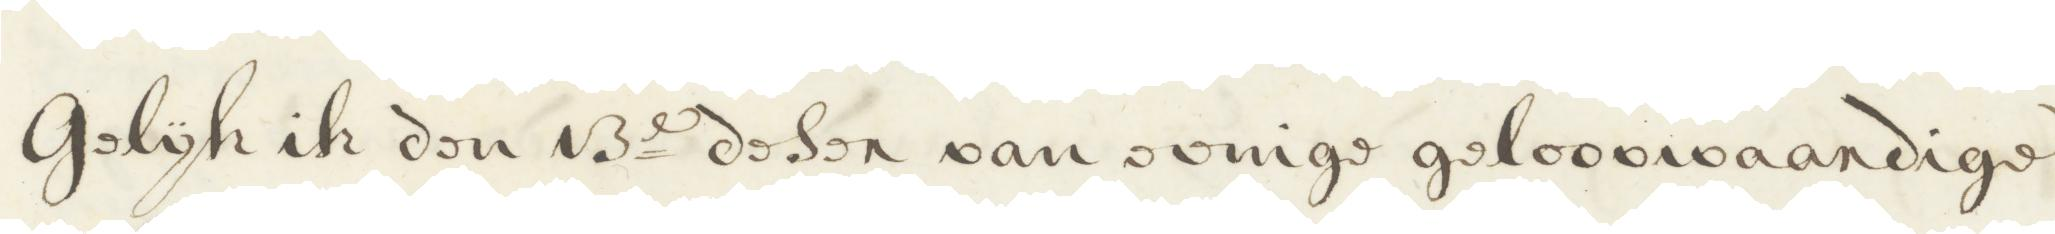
gelijk ik den 13=e deser van eenige geloovwaardige
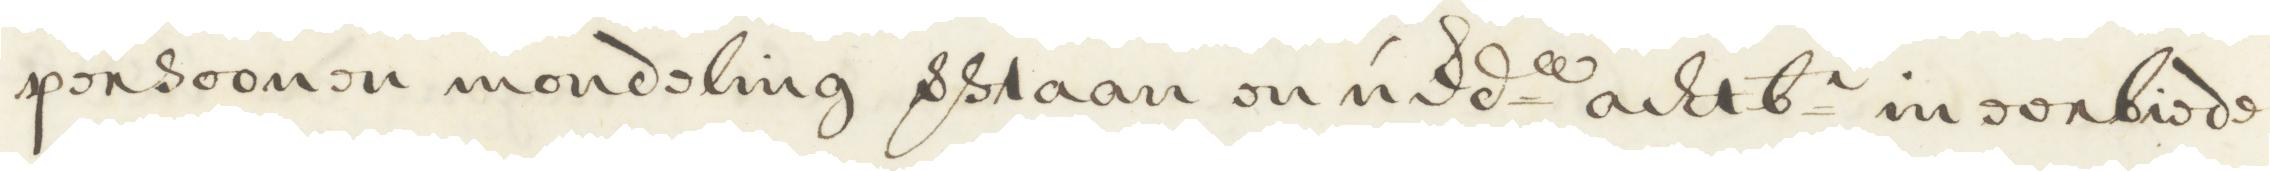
persoonen mondeling verstaan en u Ed=le achtb=r in eerbiede
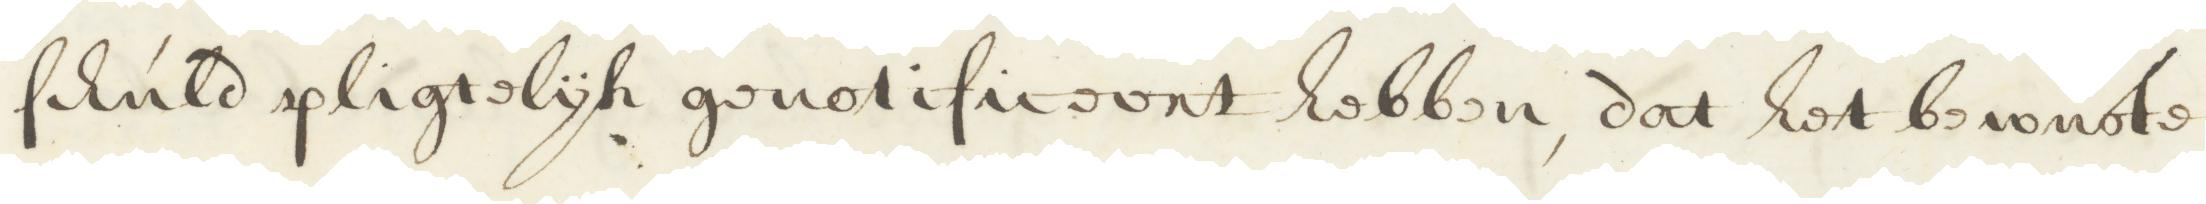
schuld pligtelijk genotificeert hebben, dat het bewuste
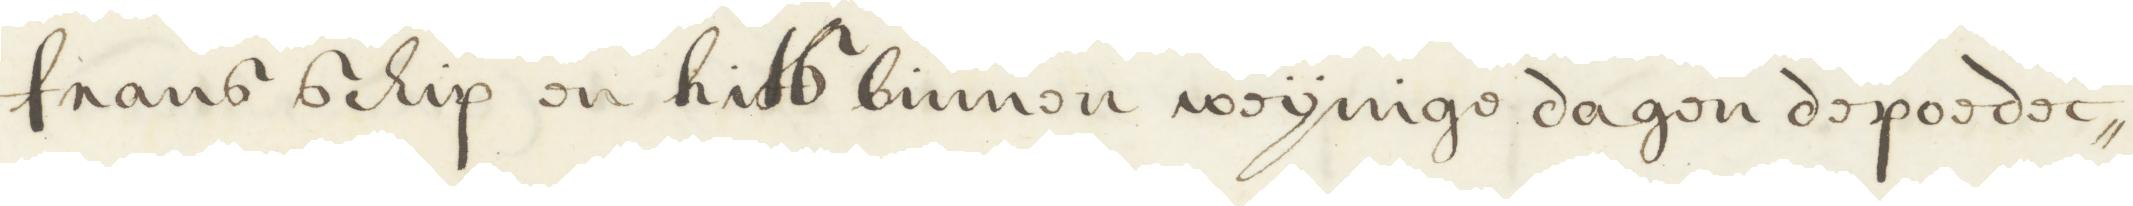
frans schip en kits binnen weijnige dagen de poedec„
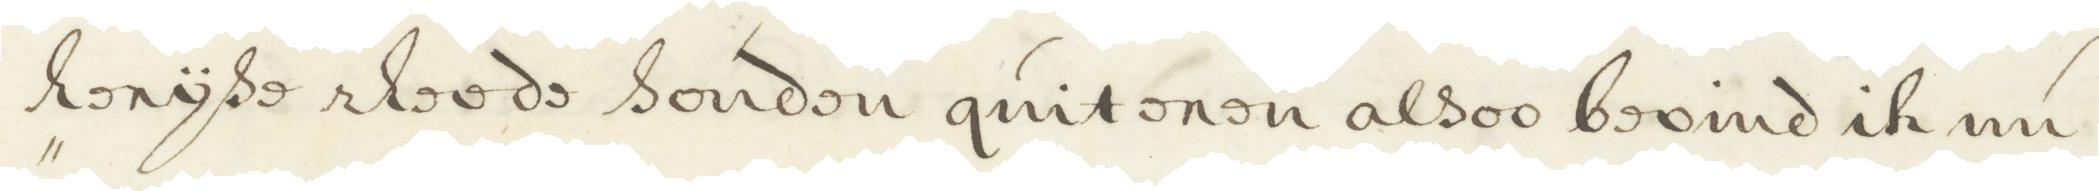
„herijse rheede souden quiteren alsoo bevind ik nu
